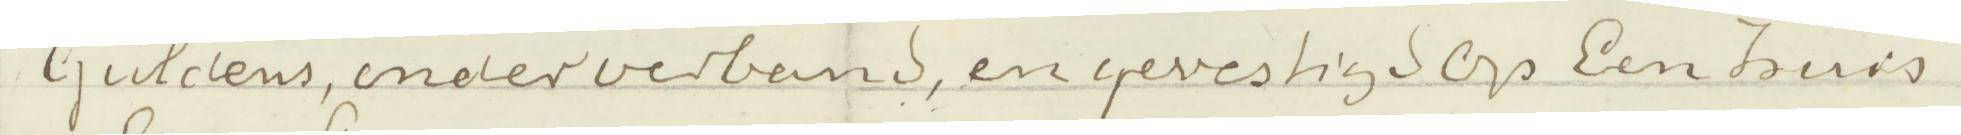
Guldens, onder verband, en gevestigd op Een huis
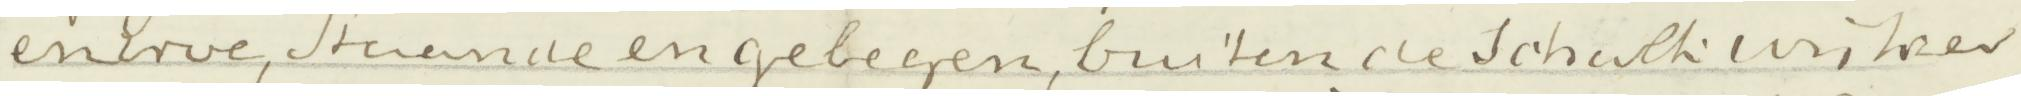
en Erve, staande en geleegen, buiten de schalkwijker
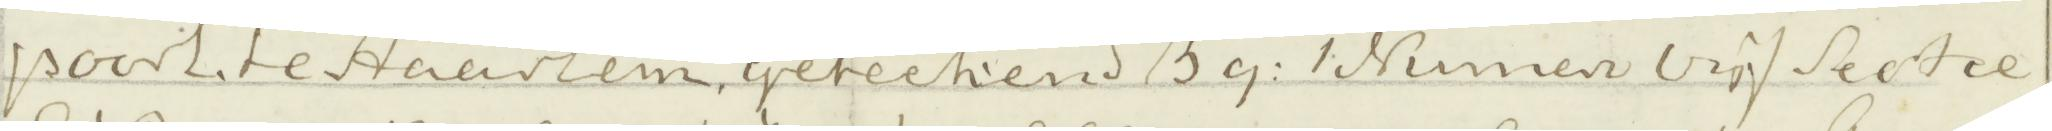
poort te Haarlem, geteekend B9: 1 Numero vijf Sectie
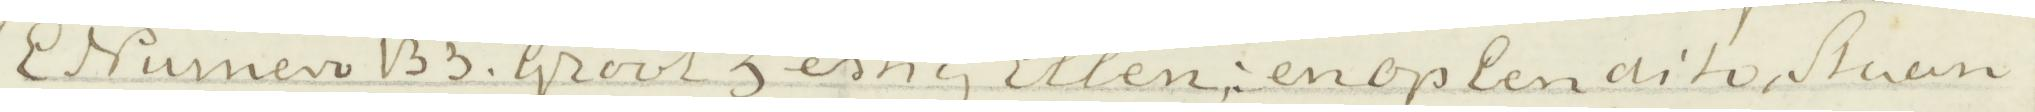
E Numero 133. Groot Zestig Ellen; en op Een dito, Staan
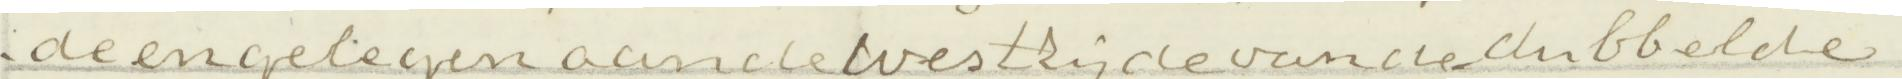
-de en gelegen aan de west zijde van de dubbelde
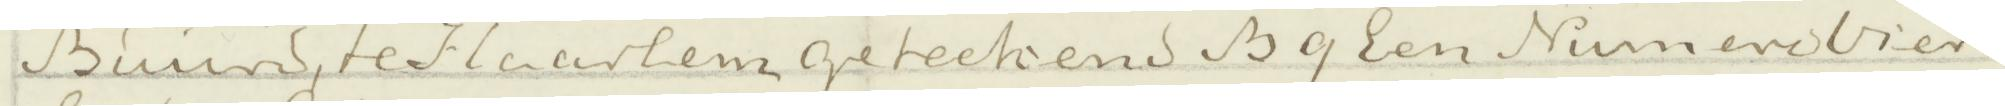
Buurd, te Haarlem geteekend B9 Een Numero vier
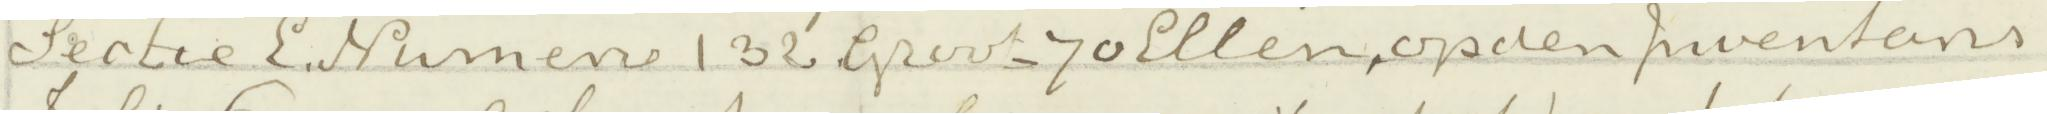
Sectie E. Numero 132 Groot 70 Ellen, op den Jnventaris
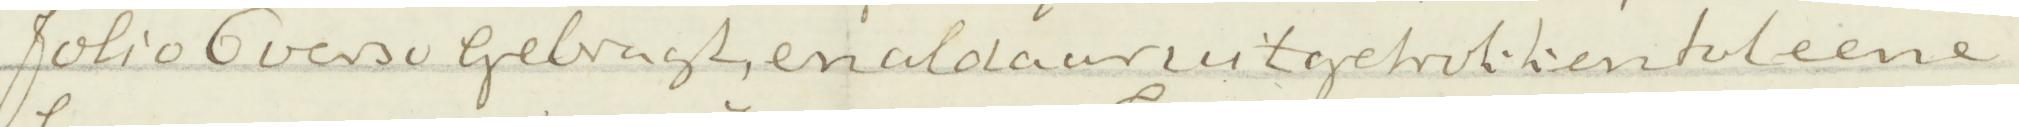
folio 6 verso Gebragt, en aldaar uitgetrokken tot eene
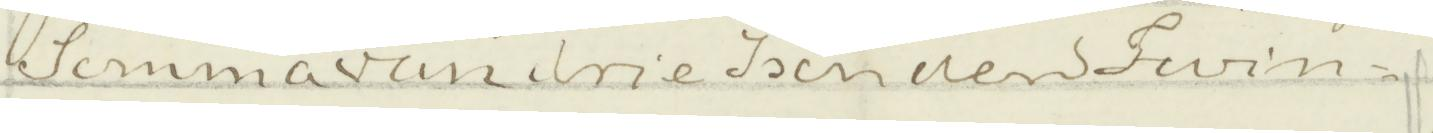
Somma van drie honderd Twin=
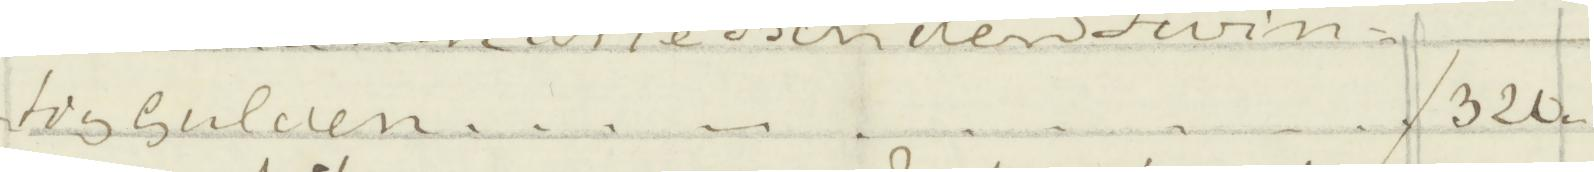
tig gulden - - - - - - - - - - - ƒ320
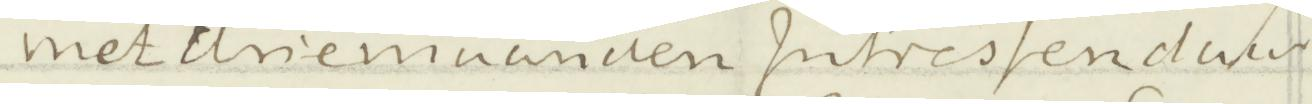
met drie maanden Jntressen daar
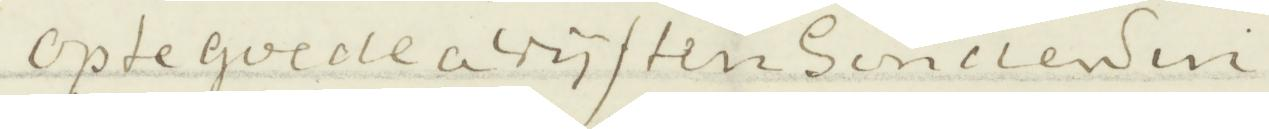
op te goede a vijften honderd in
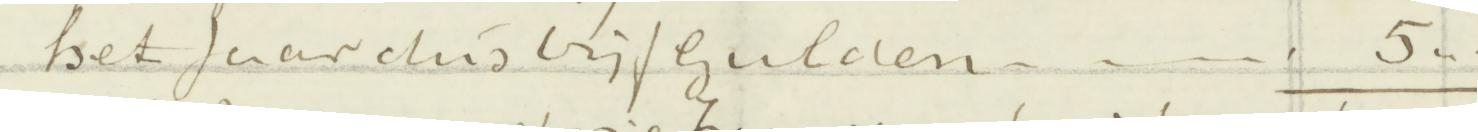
het jaar dus vijf Gulden - - - - - , 5„
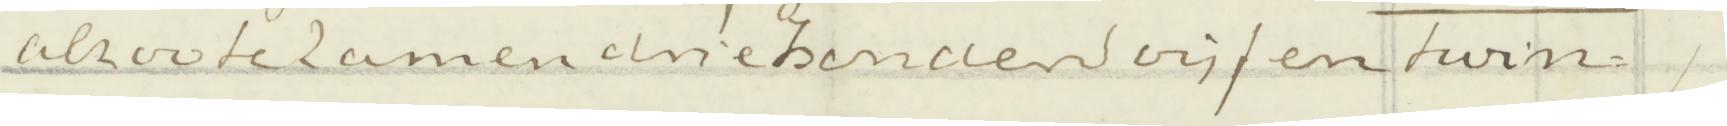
alzoo te zamen drie honderd vijf en twin=
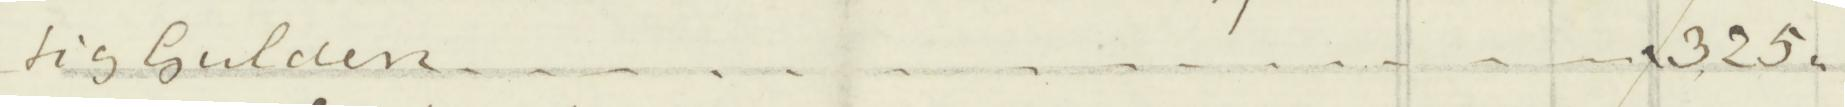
tig Gulden - - - - - - - - - - - - - - - ƒ325„
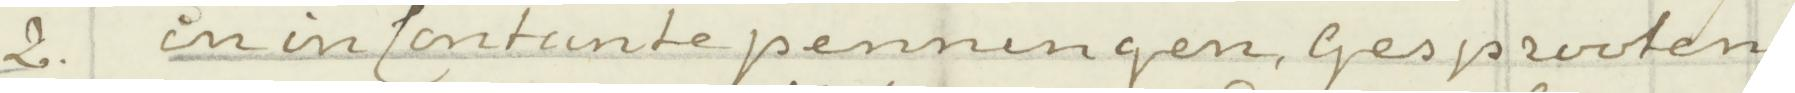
2. en in Contante penningen, gesprooten
